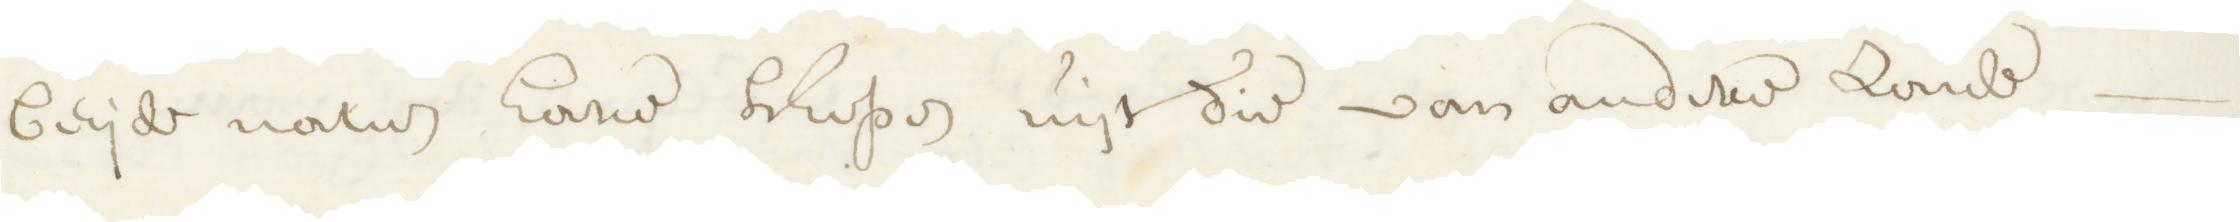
beijde natien hare schepen uijt die van andere zoude —
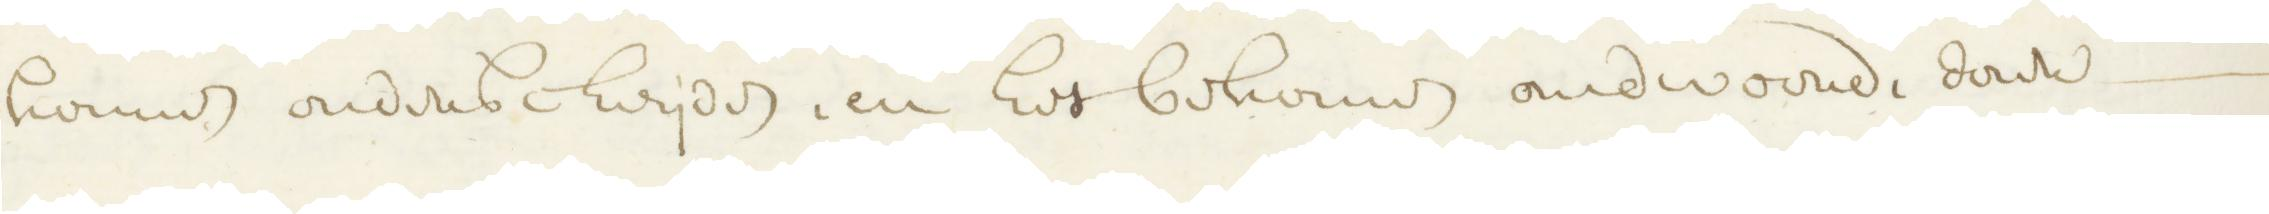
konnen onderscheijden, en het bekomen andwoord, daer —
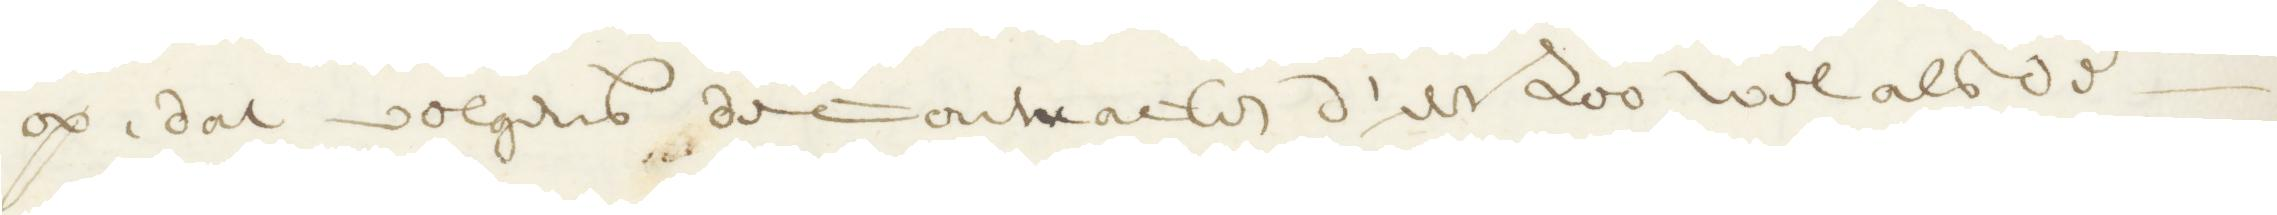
op dat volgens de contracten d' een zoo wel als de —
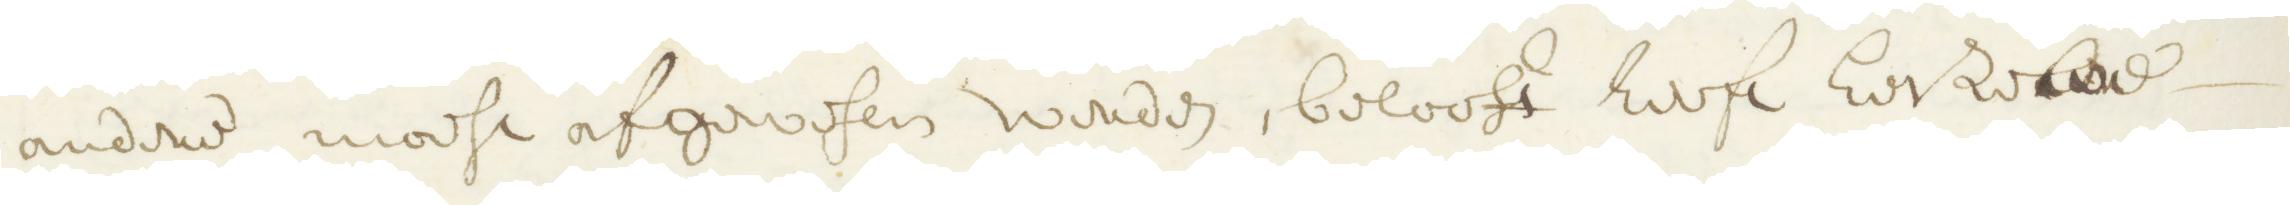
andere moest afgewesen werden, belooft heeft het zelve —
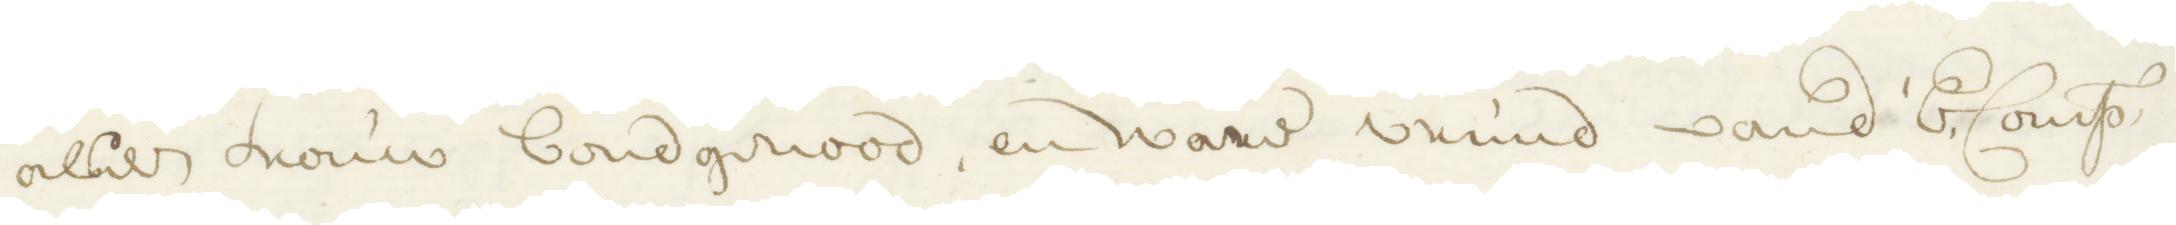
alseen trouw bondgenood, en ware vrund van d’ E. Comp.
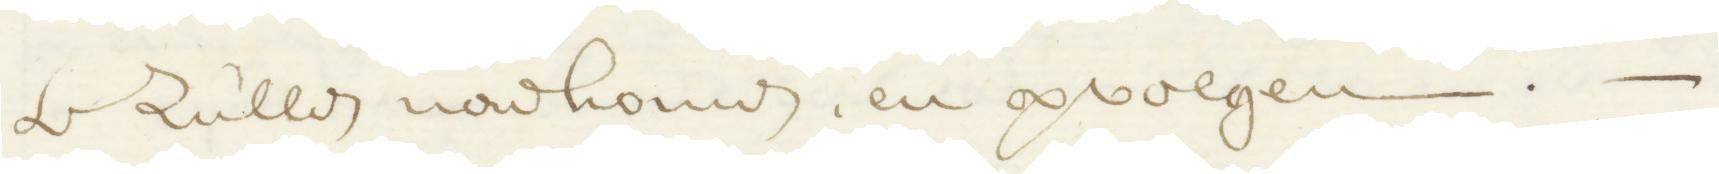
te zullen naekomen, en opvolgen. —
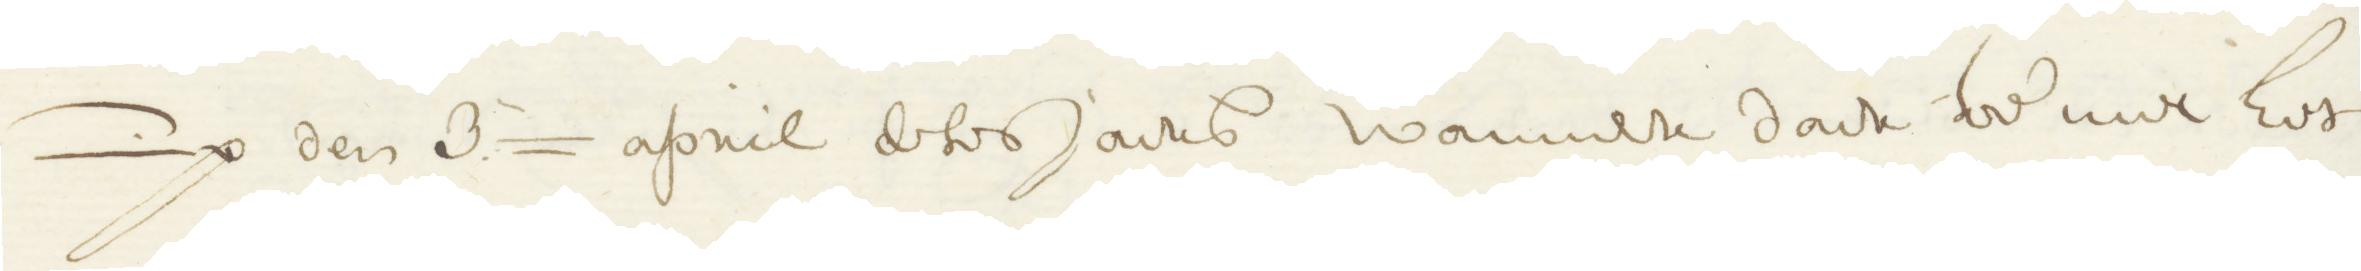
Op den 3=en april deses jaers wanneer daer te met het
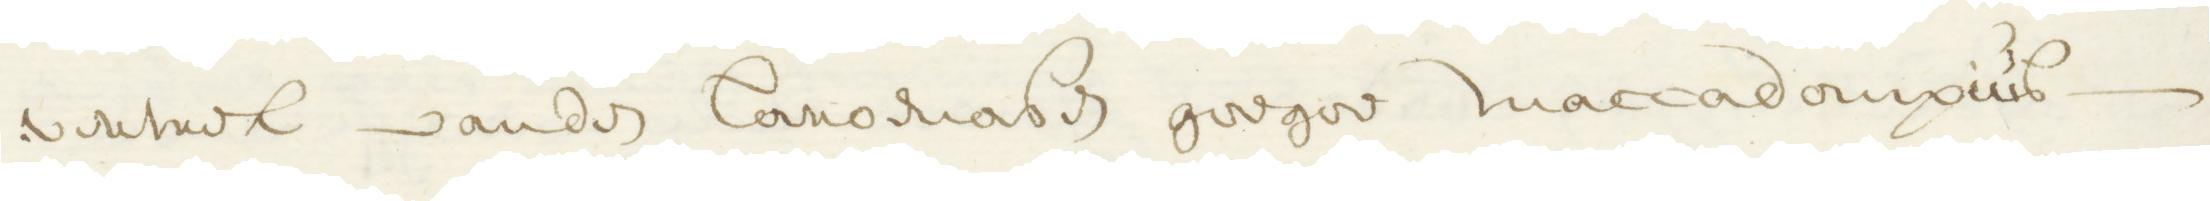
vertrek vanden Taroenasen goegoe maccadompius —
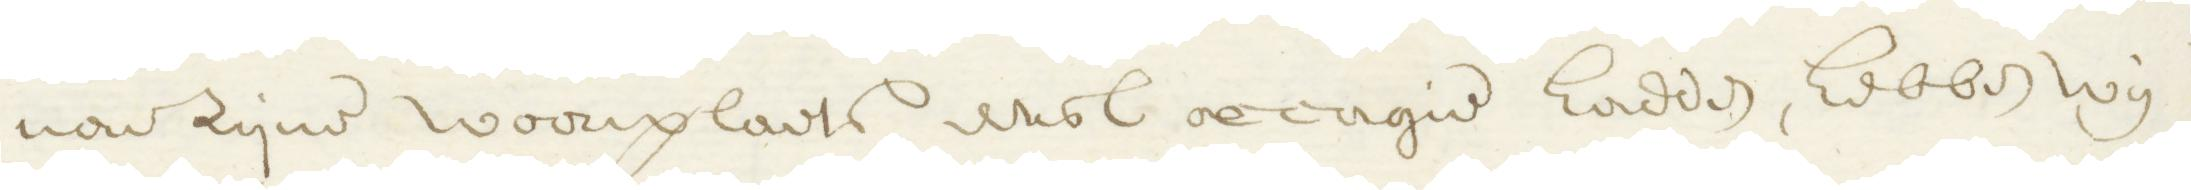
nae zijne woonplaets eerst occagie hadden, hebben wij
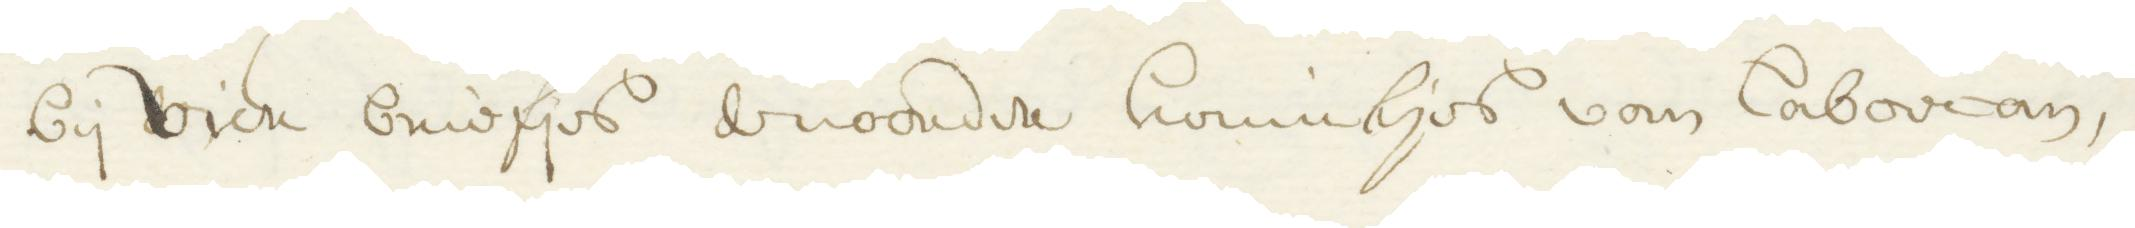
bij vier briefjes de noorder koninkjes van Taboecan,
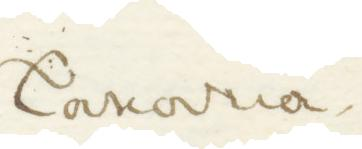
Taroena,
